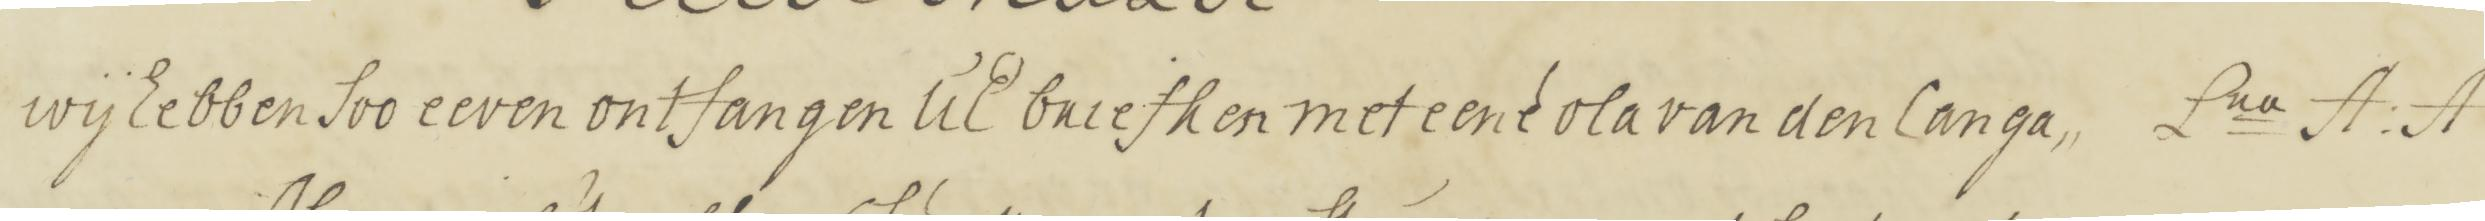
wij hebben soo eeven ontfangen uE briefken met eene ola van den Canga„ L=ra A: A
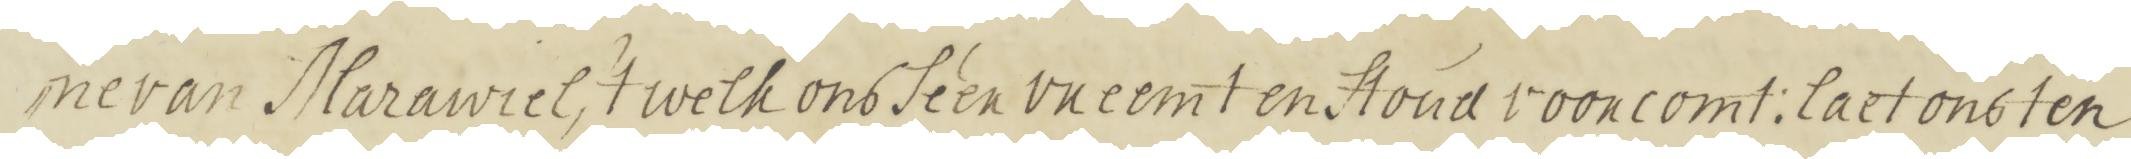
„ne van Marawiel, ’t welk ons seer vreemt en stoud voorcomt: laet ons ten
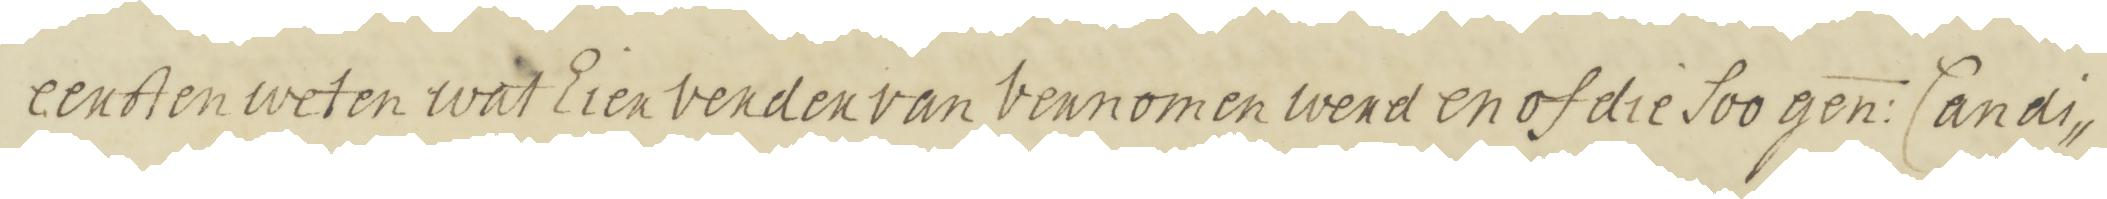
eersten weten wat hier verder van vernomen werd en of die soo gen: Candi„
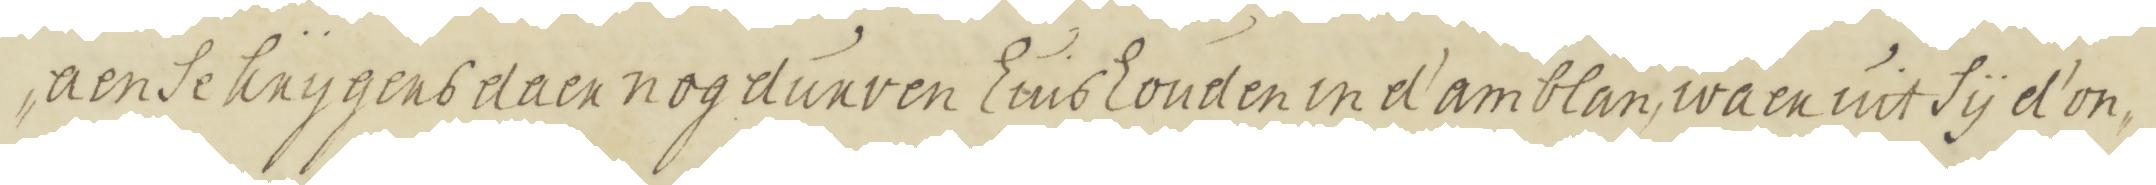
„aense krijgers daer nog durven huishouden in d' amblan, waer uit sij d'on„
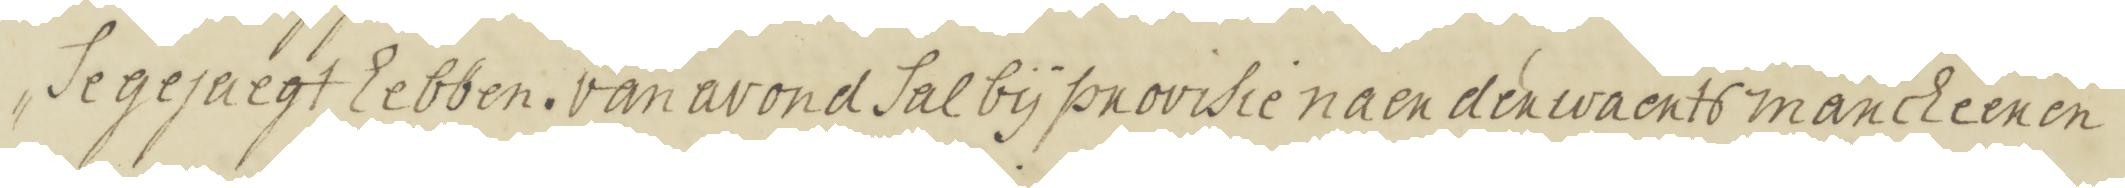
„se gejaegt hebben. vanavond sal bij provisie naer derwaerts marcheeren
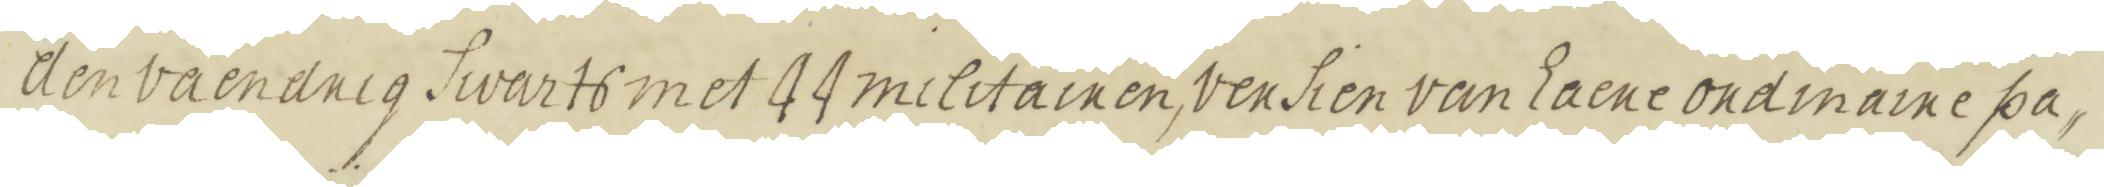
den vaendrig swarts met 44 militairen, versien van haere ordinaire pa„
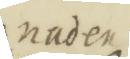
nader
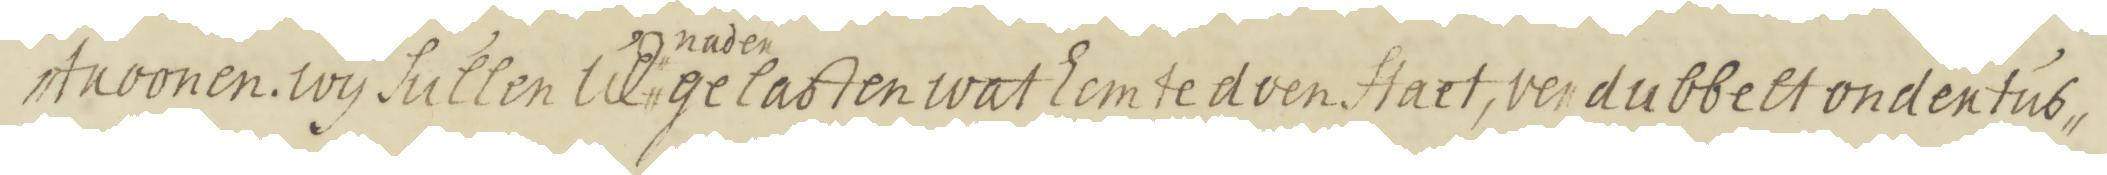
„troonen wij sullen UE„ gelasten wat hem te doen staet, verdubbelt ondertus„
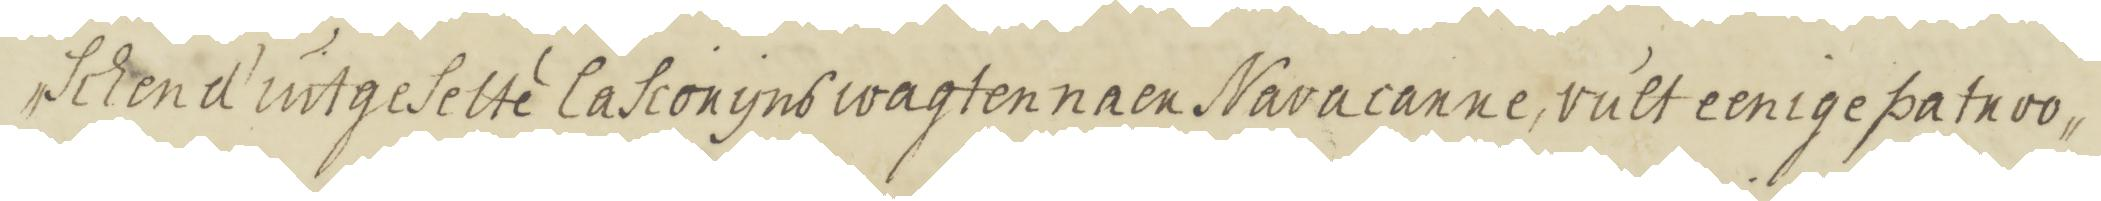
„schen d' uitgesette lascorijns wagten naer Navacarre, vult eenige patroo„
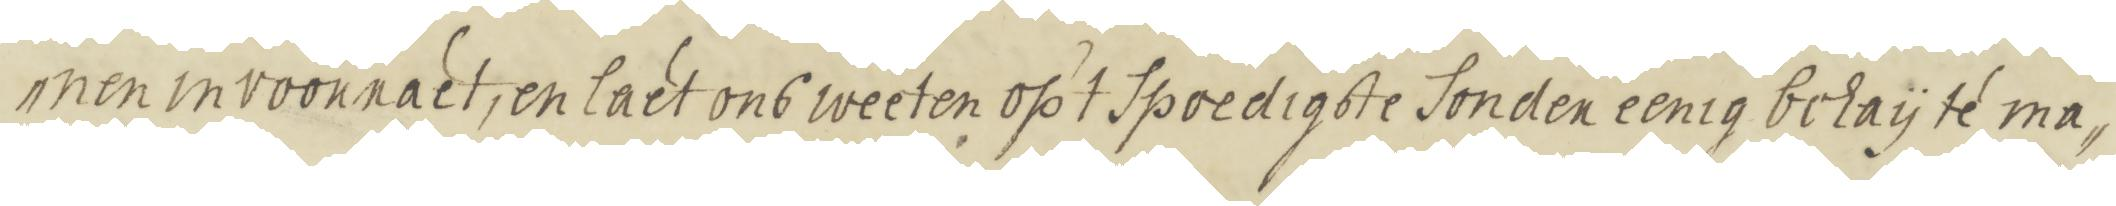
„nen in voorraet, en laet ons weeten op ’t spoedigste sonder eenig bohaij te ma„
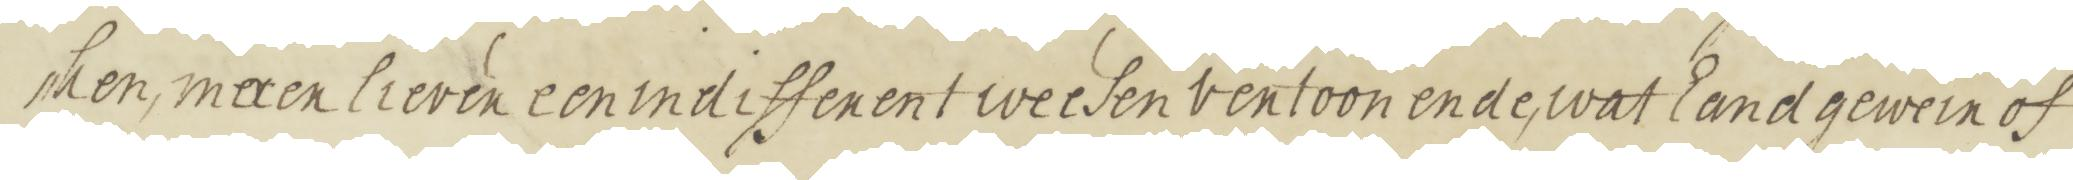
„ken, maer liever een in different weesen vertoonende, wat handgeweir of
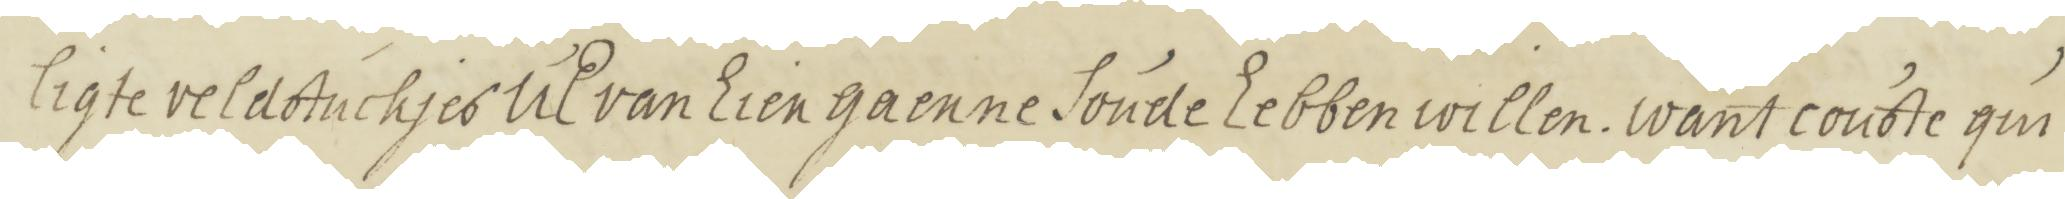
ligte veldstuckjes UE van hier gaenne soude hebben willen want couste qui
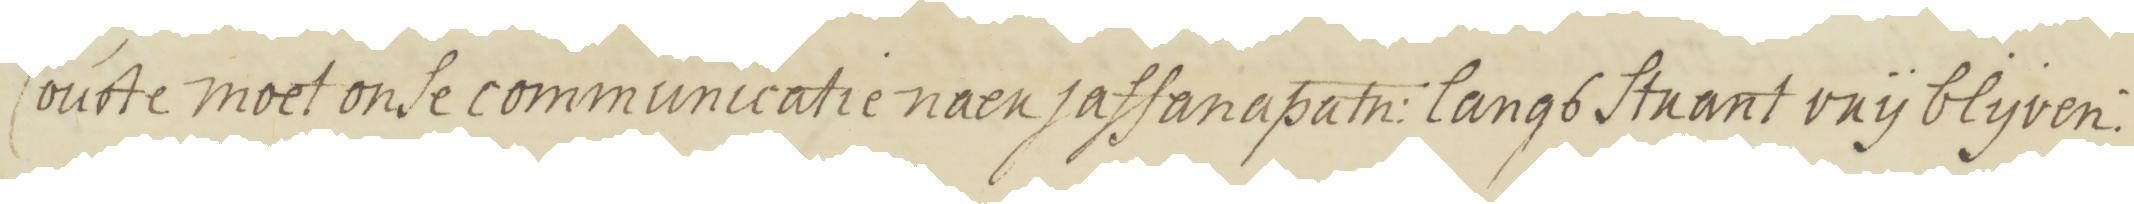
Couste moet onse communicatie naer jaffanapatn: langs strant vrij blijven.
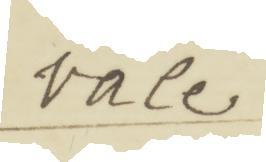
vale
